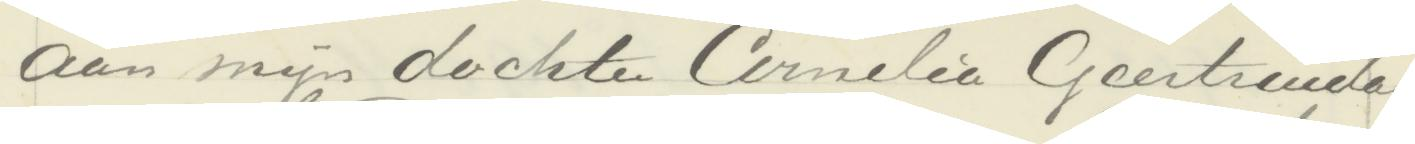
aan mijn dochter Cornelia Geertruida
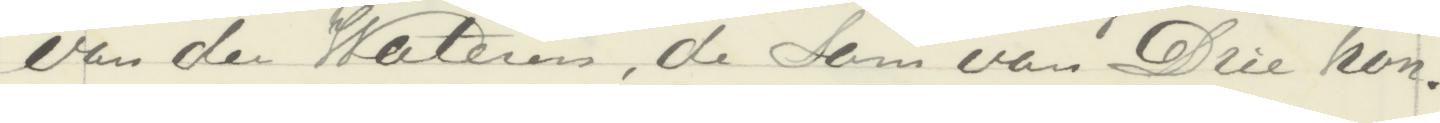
van der Wateren, de Som van Drie hon.
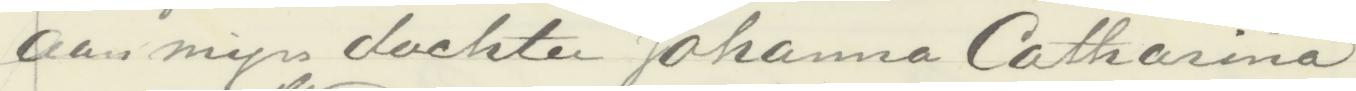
aan mijn dochter Johanna Catharina
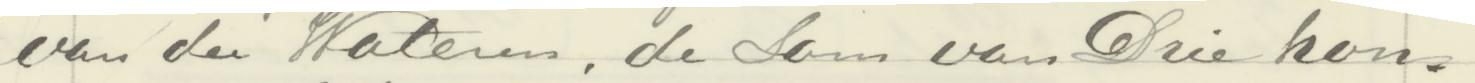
van der Wateren, de Som van Drie hon-
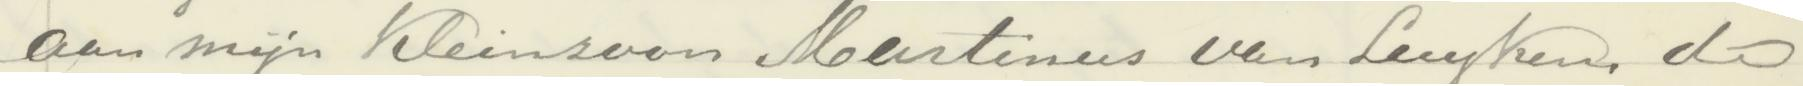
aan mijn kleinzoon Martinus van Luyken, de
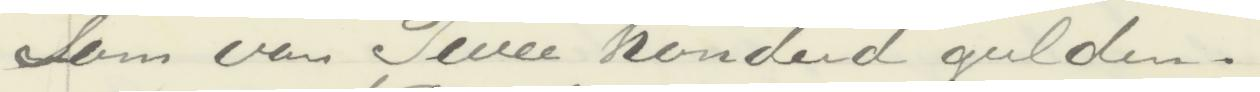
Som van Twee honderd gulden.
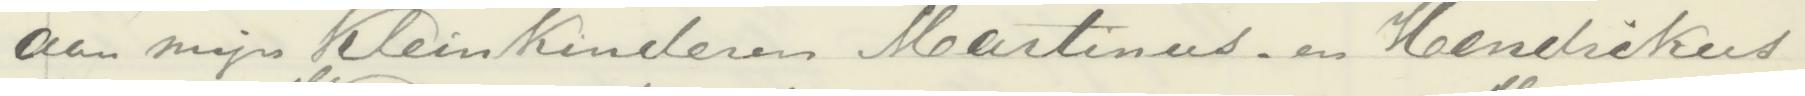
aan mijn kleinkinderen Martinus - en Hendrikus
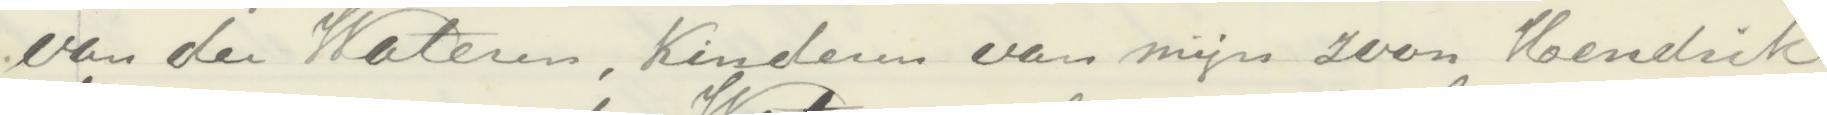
van der Wateren, kinderen van mijn zoon Hendrik
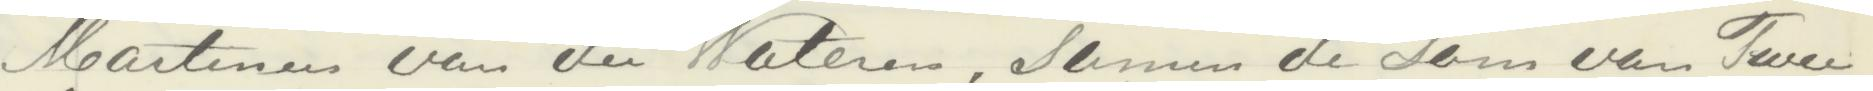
Martenes van der Wateren, samen de Som van Twee
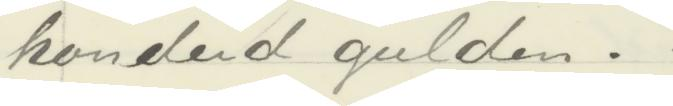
honderd gulden.
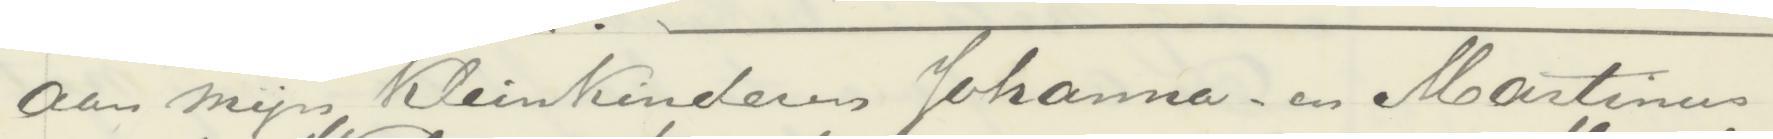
aan mijn kleinkinderen Johanna - en Martinus
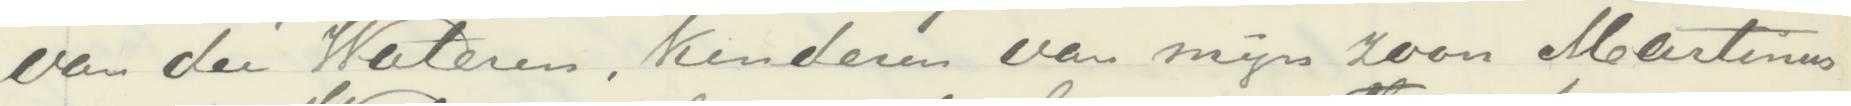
van der Wateren, kinderen van mijn zoon Martinus
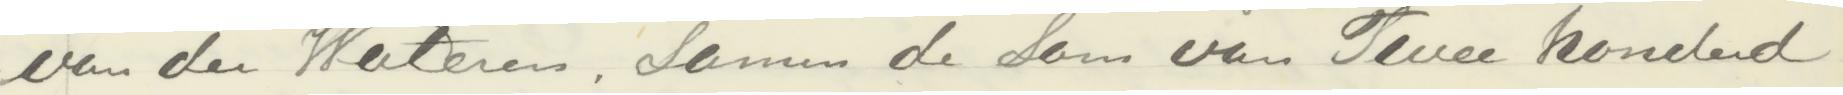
van der Wateren, samen de Som van Twee honderd
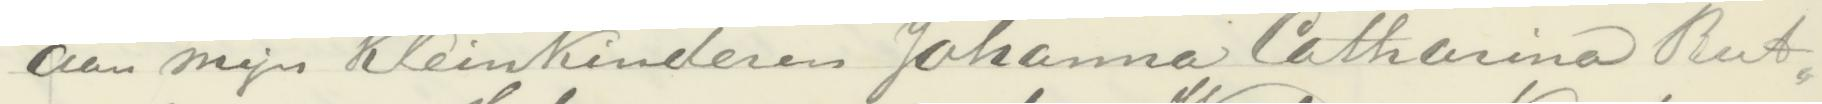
aan mijn kleinkinderen Johanna Catharina Rut„
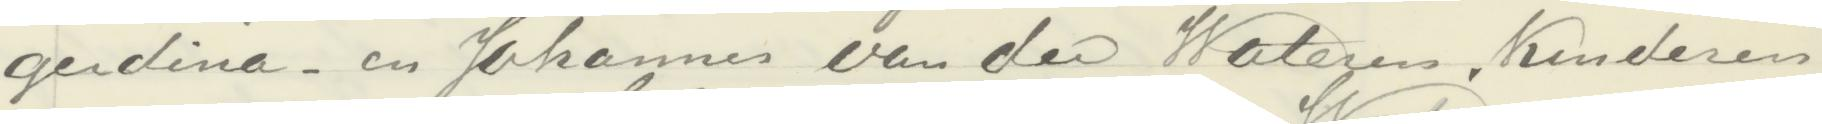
gerdina - en Johannes van der Wateren, kinderen
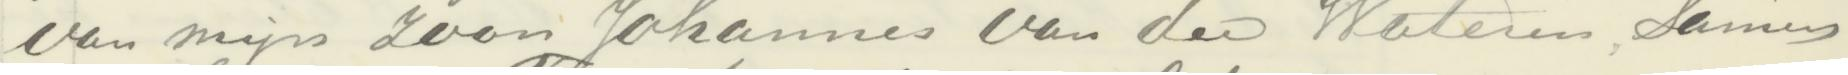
van mijn zoon Johannes van der Wateren, samen
